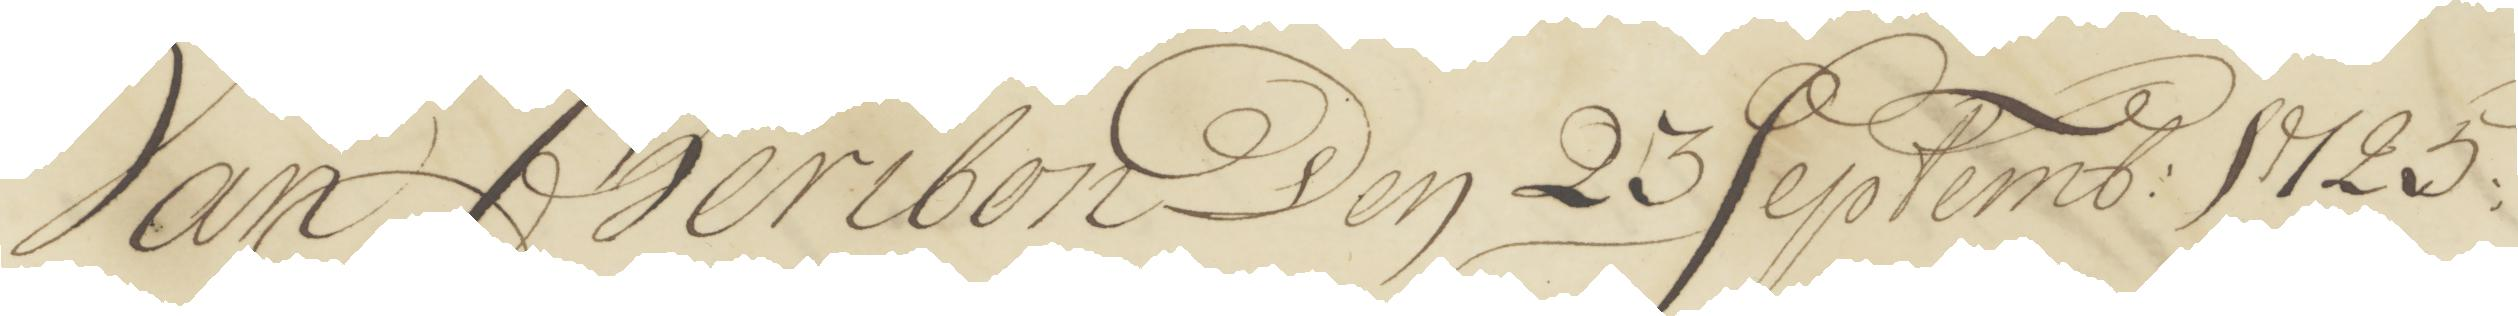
Van Cheribon Den 23 Septemb: 1725;
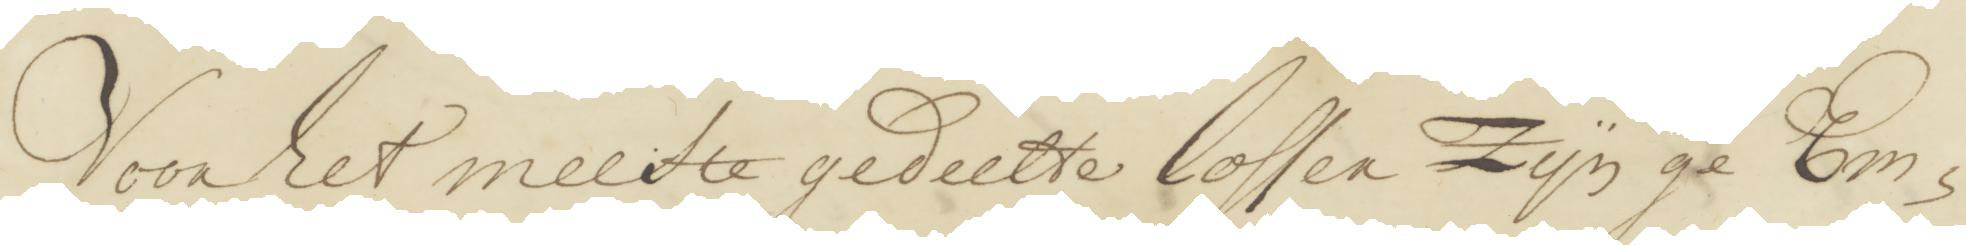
Voor het meeste gedeelte losser Zijn ge Em„
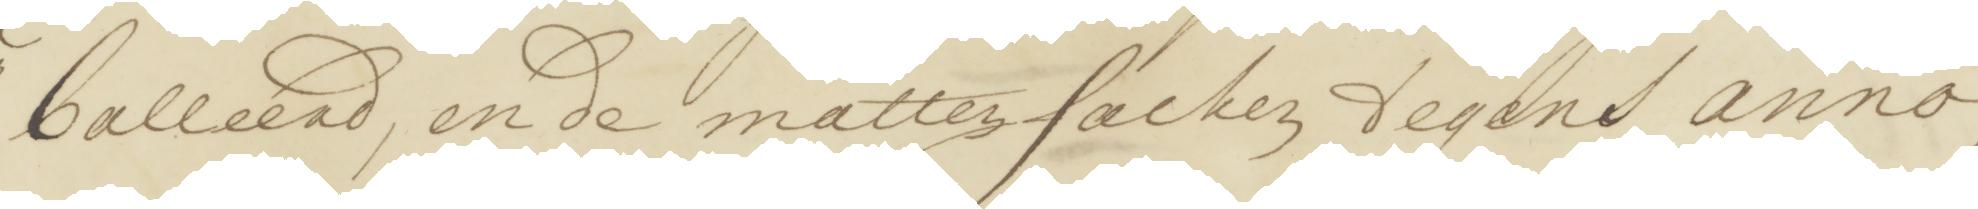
balleerd, en de matten sacken tegens anno
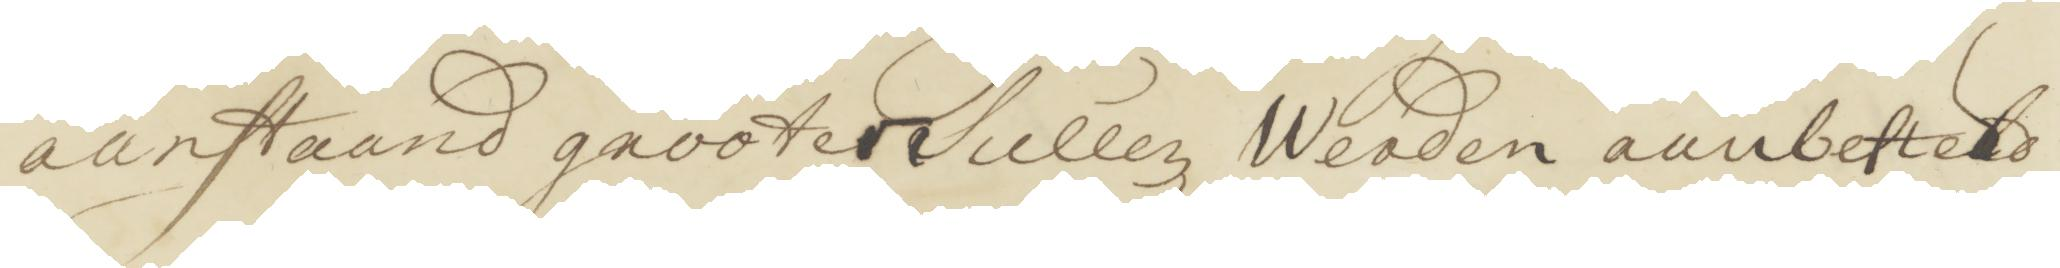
aanstaand grooter Sullen Werden aanbesteld
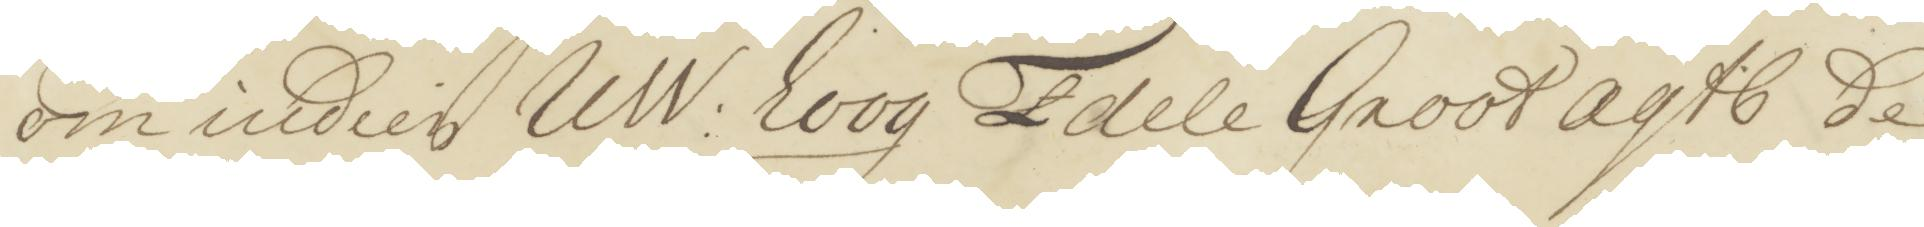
om indien UW: hoog Edele Groot agtb de
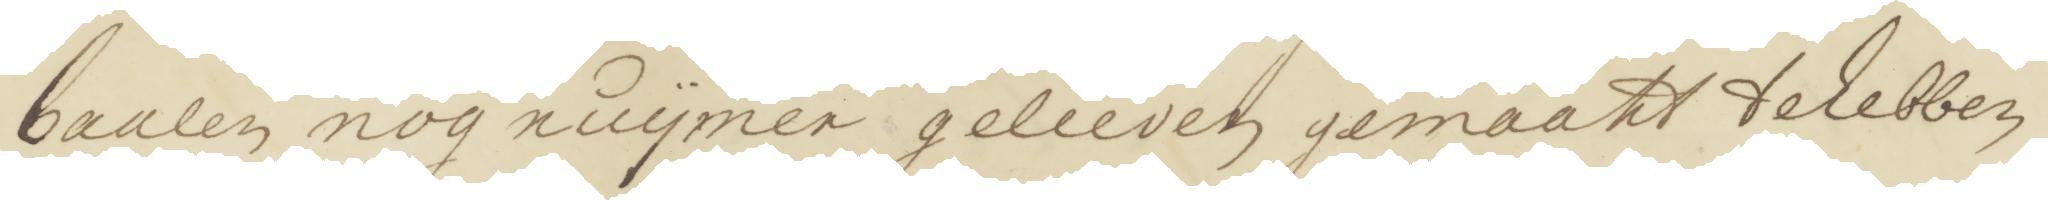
baalen nog ruijmer gelieven gemaakt te hebben
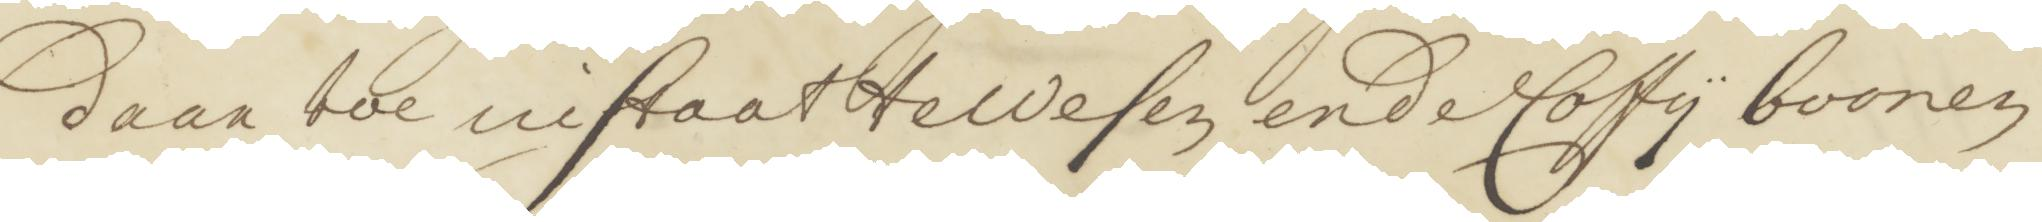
daar toe instaat te wesen ende Coffij boonen
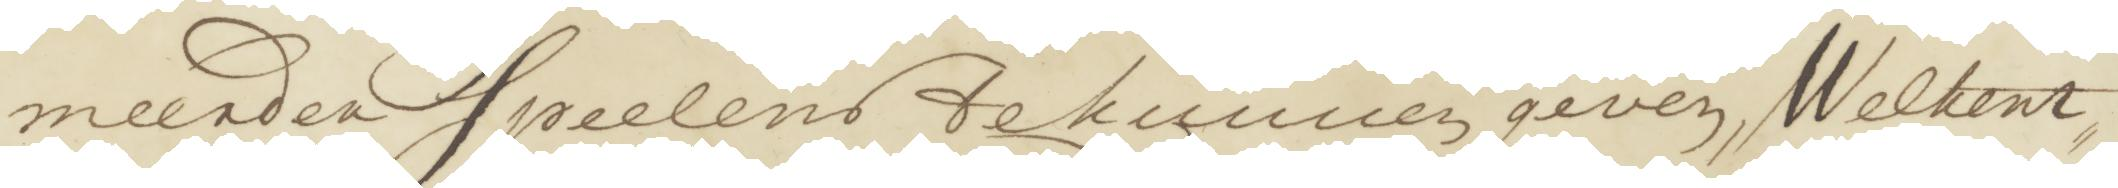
meerder speelens te kunnen geven, Welkent„
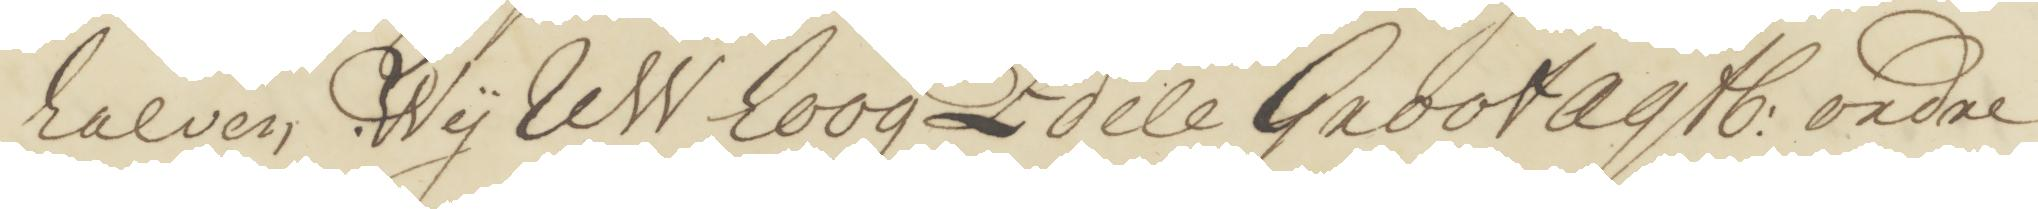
halven Wij UW hoog Edele Groot agtb: ordre
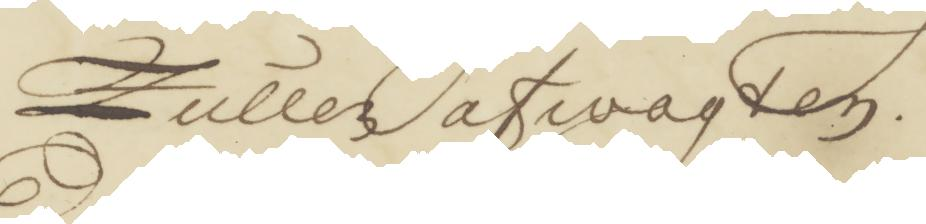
Zullen afwagten.
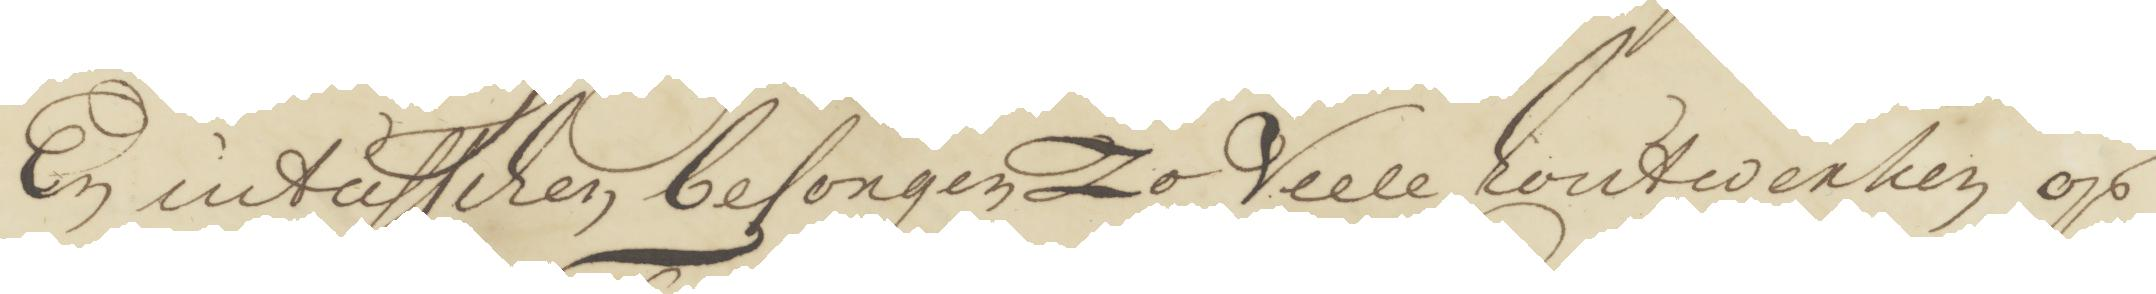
En intusschen besorgen Zo Veele houtwerken op
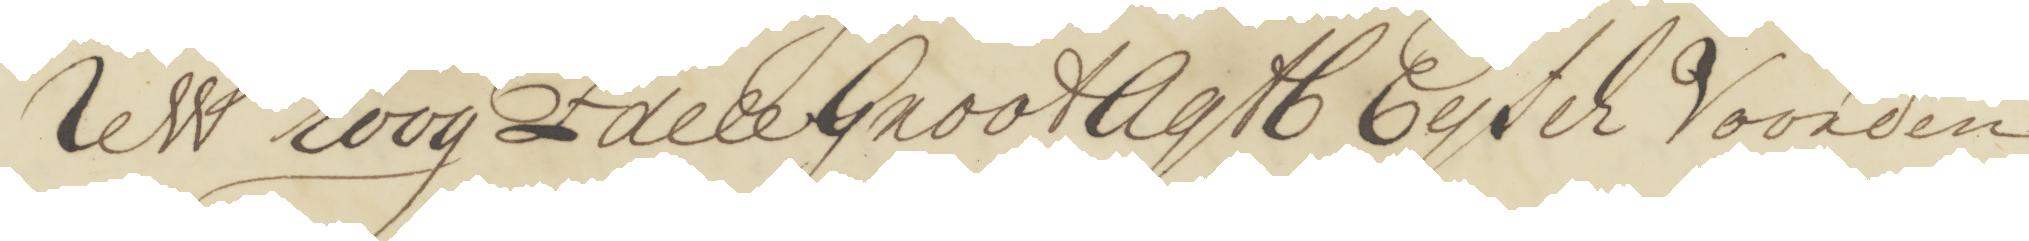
UW hoog Edele Groot Agtb Eysch Voor den
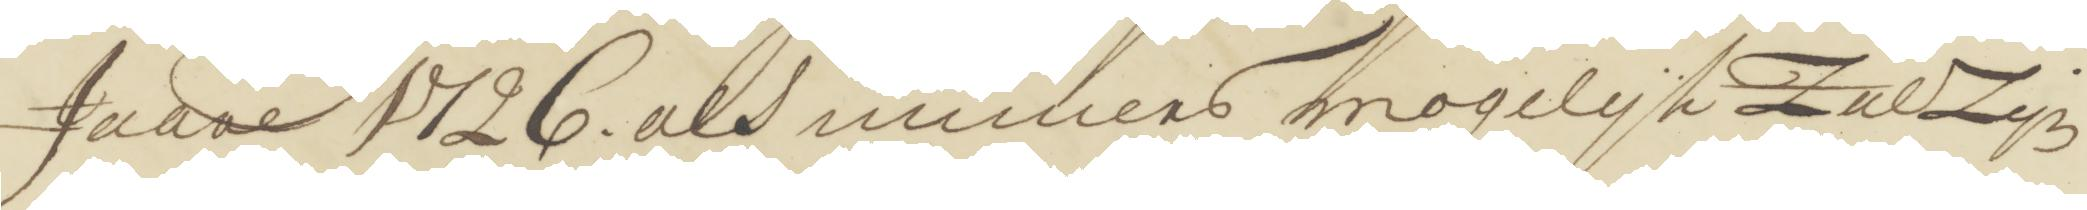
Jaare 1726. als immers mogelijk Zal Zijn
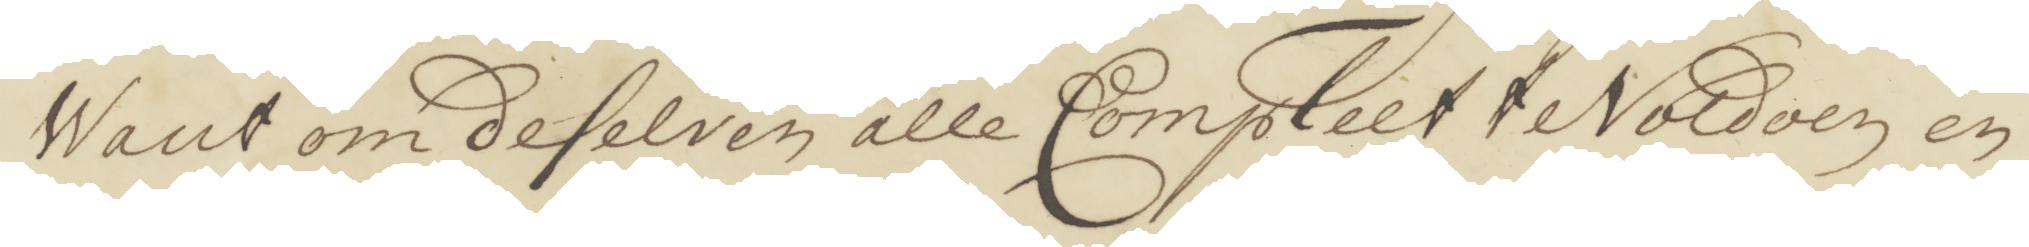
Want om deselven alle Compleet te Voldoen en
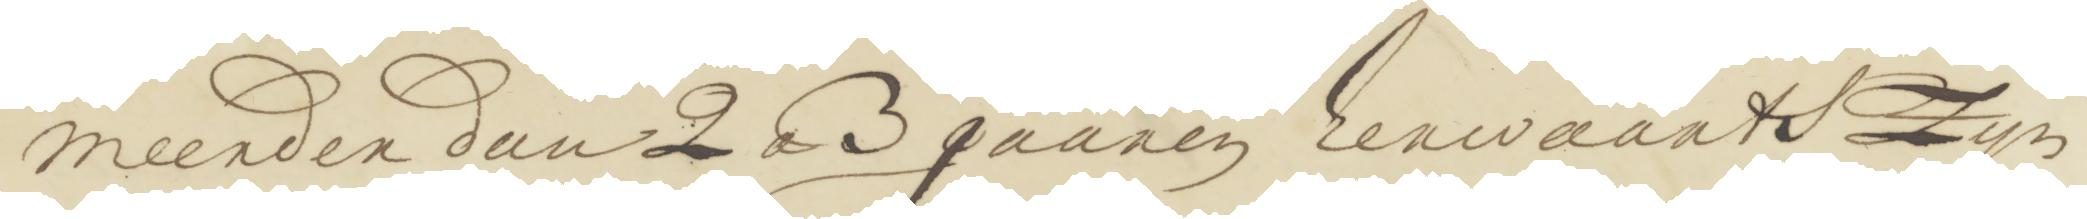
meerder dan 2 a 3 jaaren herwaarts Zijn
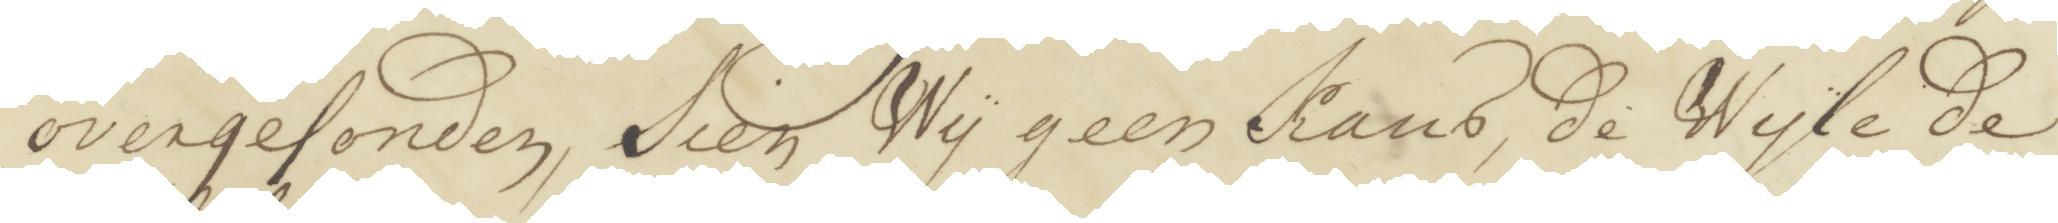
overgesonden, Sien Wij geen kans, de Wijle de
